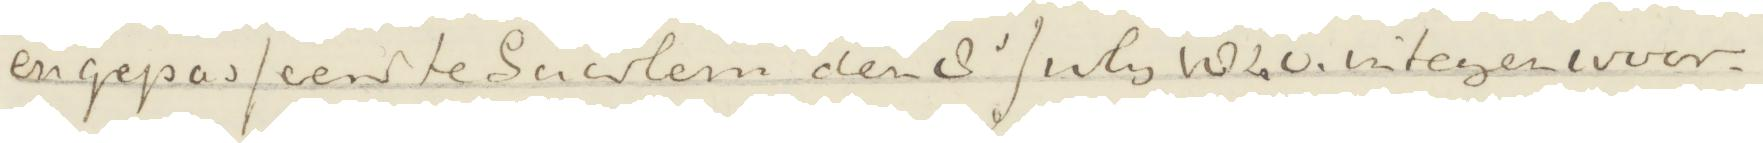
en gepasseerd te haarlem den 8' July 1840. in tegenwoor-
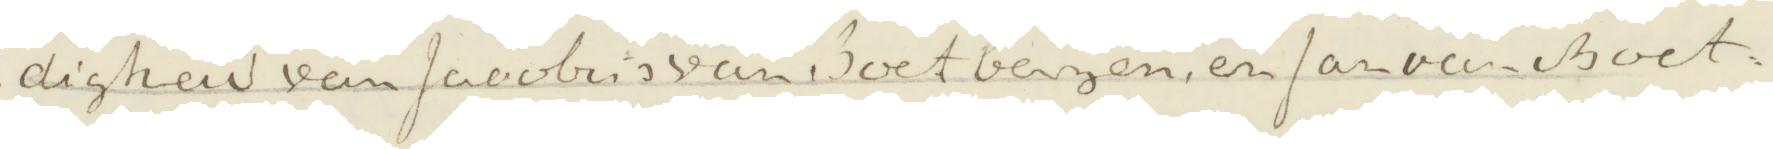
-digheid van Jacobus van Boetbergen, en Jan van Boet=
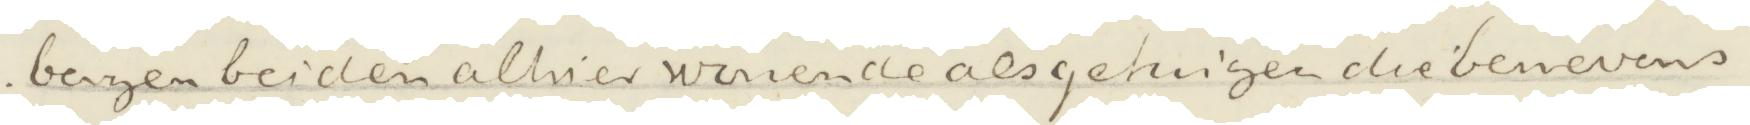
-bergen beiden alhier wonende als getuigen die benevens
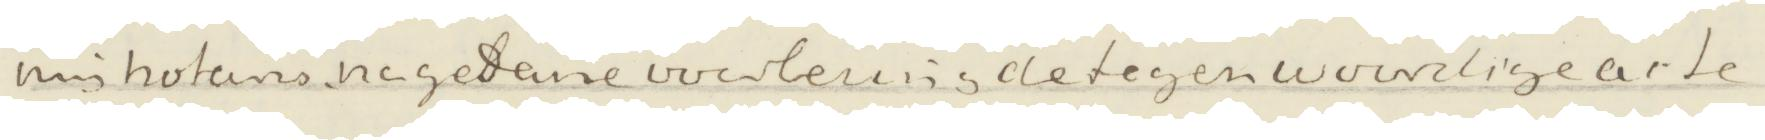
mij notaris, na gedane voorlezing de tegenwoordige acte
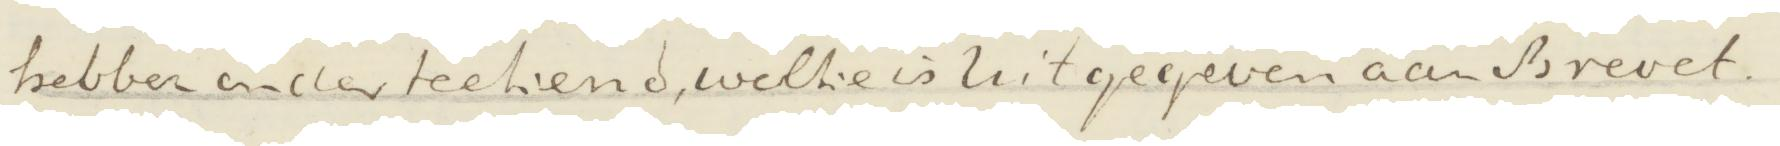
hebben onderteekend, welke is Uitgegeven aan Brevet.
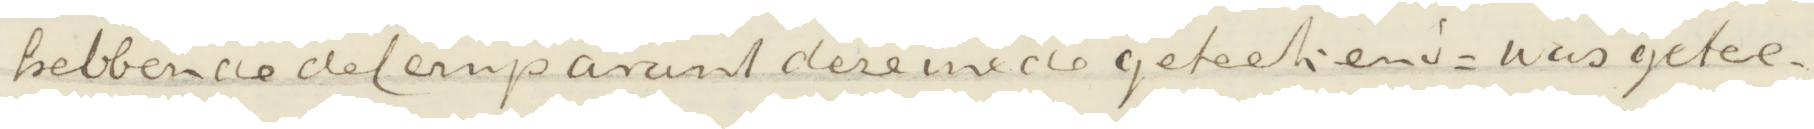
hebbende de Comparant deze mede geteekend = was getee-
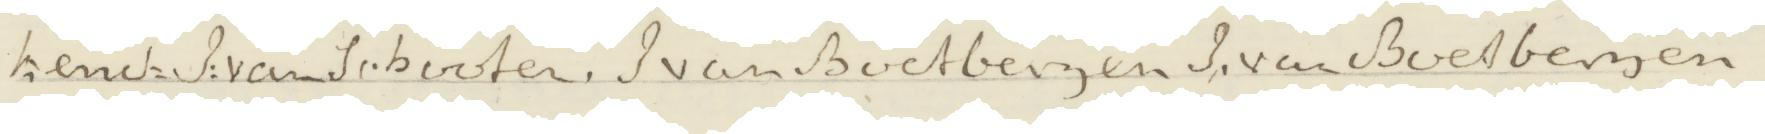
Kend - I: van Schooten , I van Boetbergen I. van Boetbergen
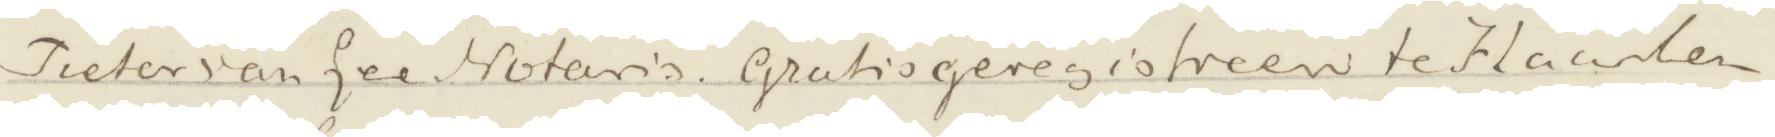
Pieter van Lee Notaris. Gratis geregistreerd te Haarlem
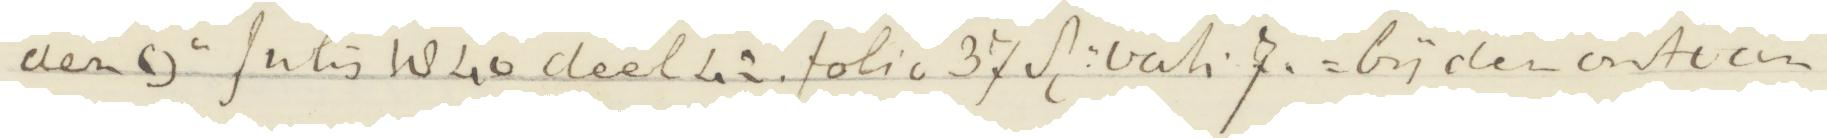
den 9' Julij 1840 deel 42. folio 37 V.' vak 7. = bij den ontvan
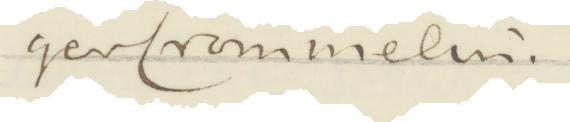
ger Crommelin.
